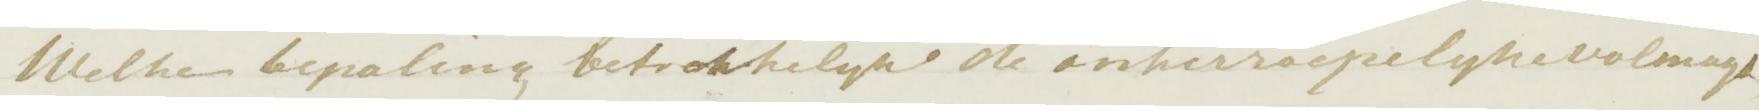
Welke bepaling betrokkelyk de onherroepelyke volmagt
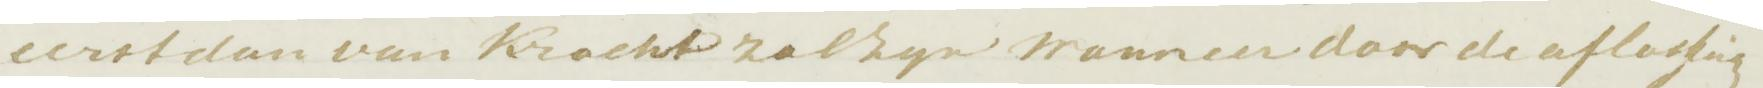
eerst dan van kracht zal zyn wanneer door de aflossing
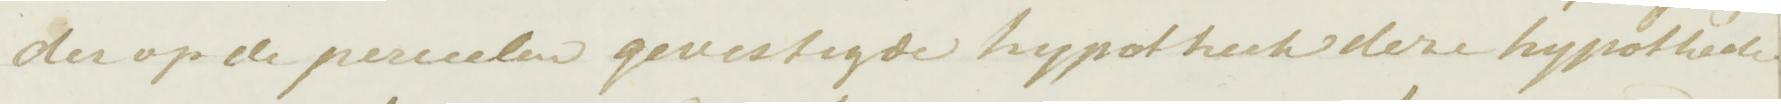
der op de perceelen gevestigde hypotheek deze hypotheek
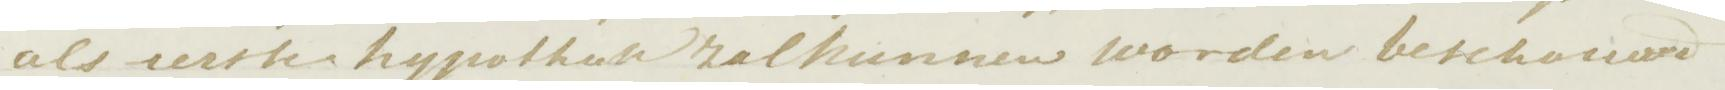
als eerste hypotheek zal kunnen worden beschouwd
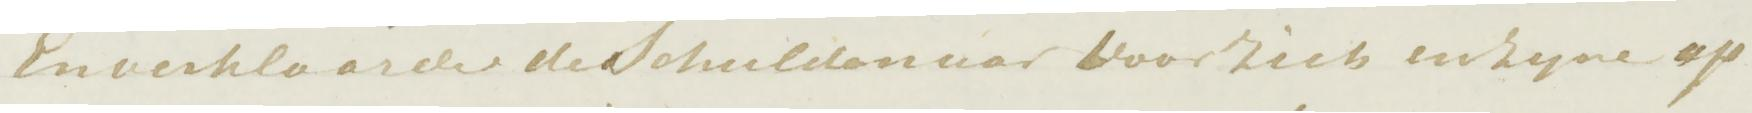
En verklaarde de schuldenaar voor zich en zyne op
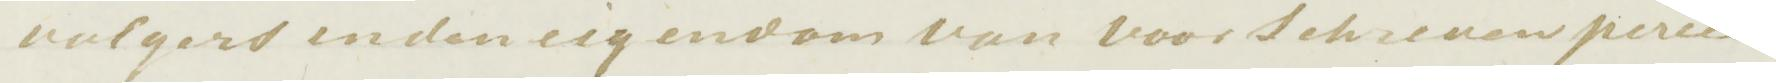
volgers in den eigendom van voor schreven percee
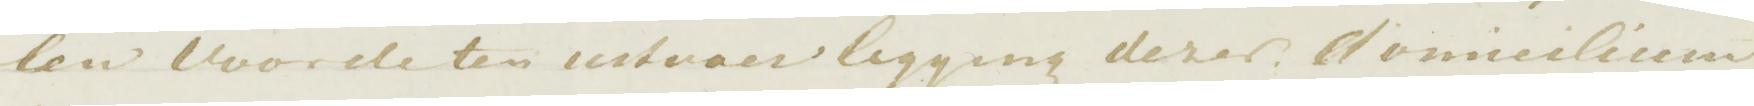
len voor de ten uitvoer ligging dezer domicilium
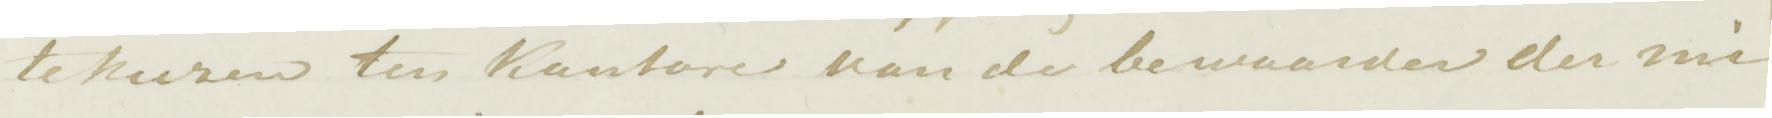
te kiezen ten Kantore van de bewaarder der mi
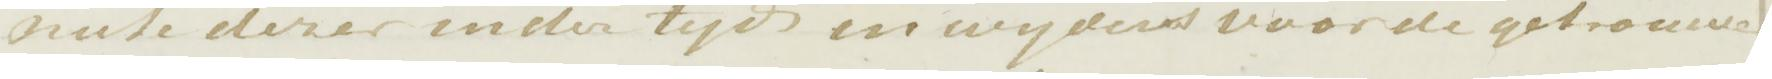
nute dezer inder tyd en wyders voor de getrouwe
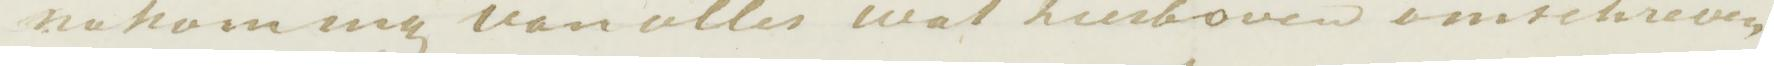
nakoming van alles wat hierboven omschreven
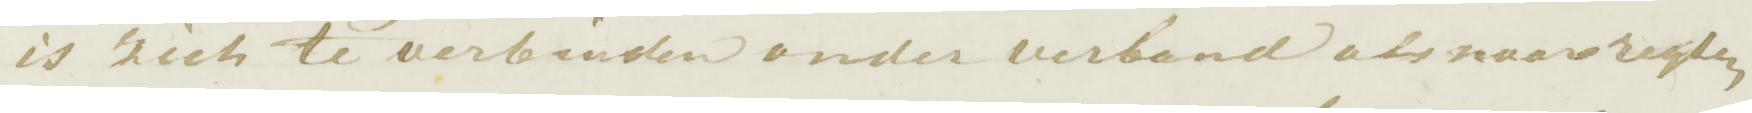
is zich te verbinden onder verband als naar regten
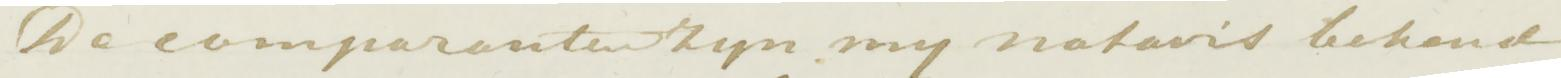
De comparanten zyn my notaris bekend
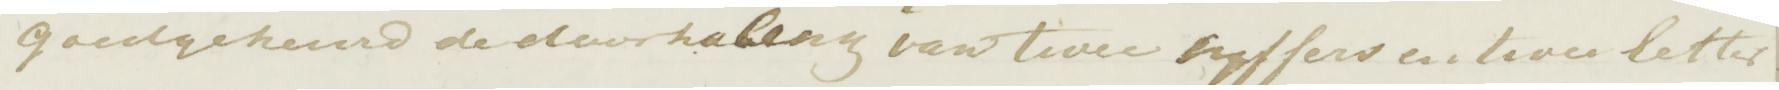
goedgekeurd de doorhaling van twee cijffers en twee letter
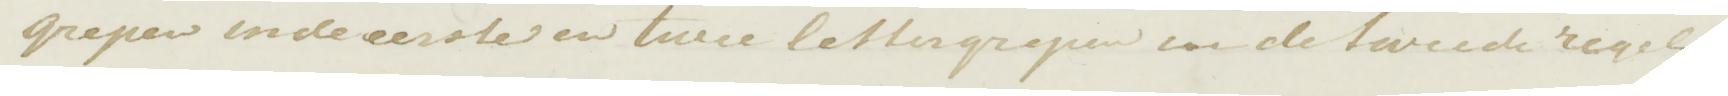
grepen in de eerste en twee lettergrepen in de tweede regel
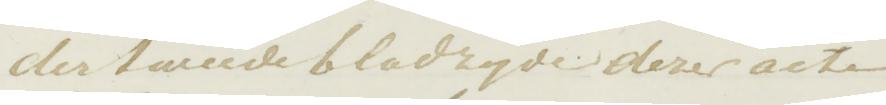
der tweede bladzijde dezer acte
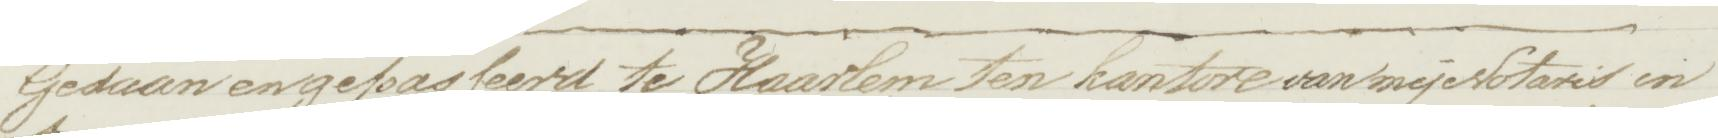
Gedaan en gepasseerd te Haarlem ten kantore van mij Notaris in
